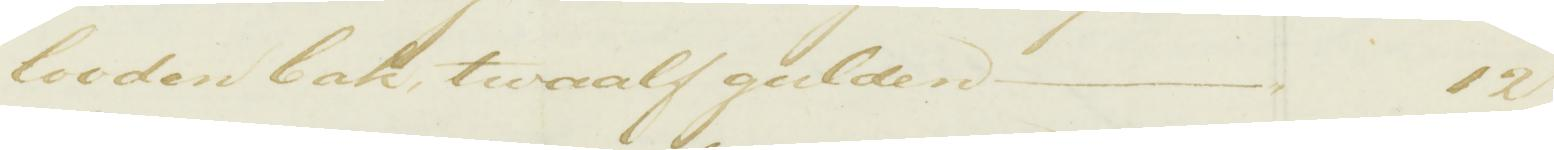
looden bak, twaalf gulden———— „ 12
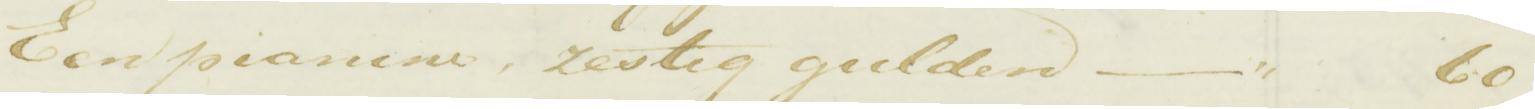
Een pianino, zestig gulden ——— „ 60
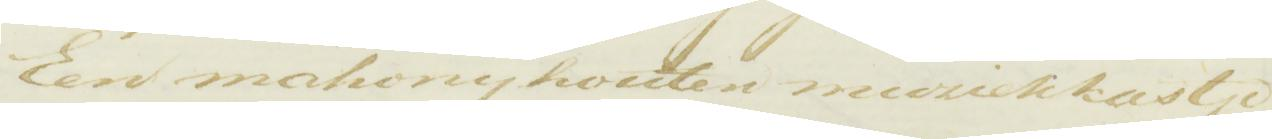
Een mahonyhouten muziek kastje
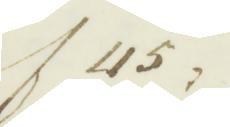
ƒ 45 ;
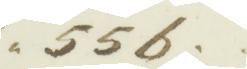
„ 556;
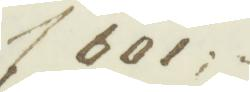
ƒ 601; -
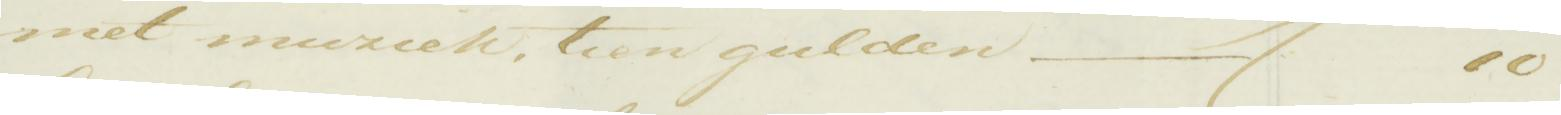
met muziek, tien gulden——— ƒ 10
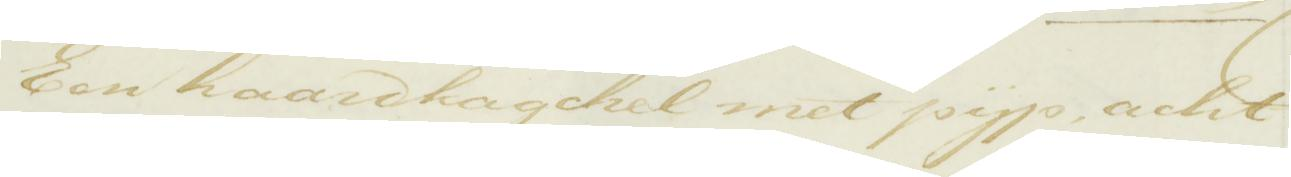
Een haardkagchel met pijp, acht
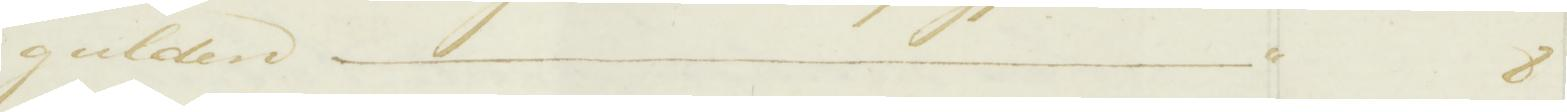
gulden ——————————— „ 8
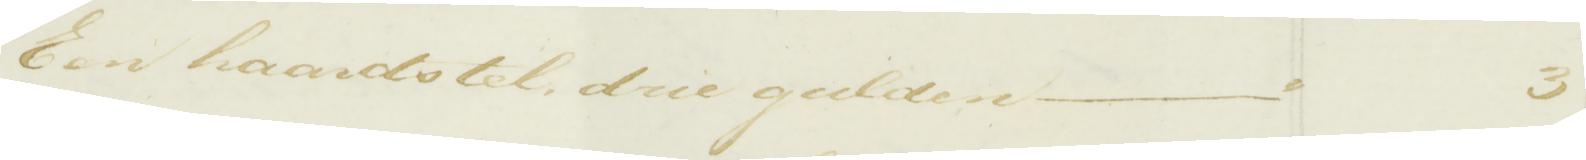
Een haardstel, drie gulden ———„ 3
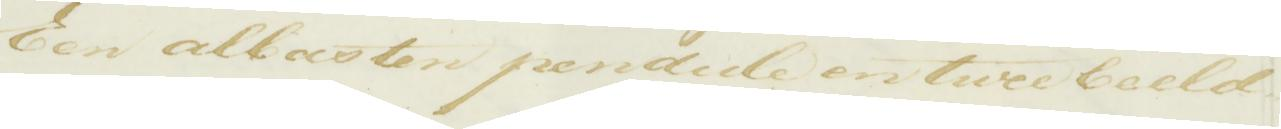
Een albasten pendule en twee beeld
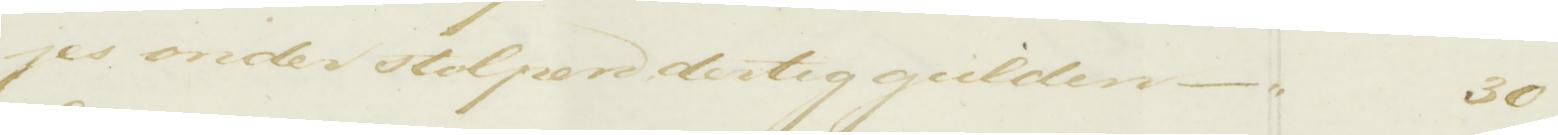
jes onder stolpen, dertig gulden —„ 30
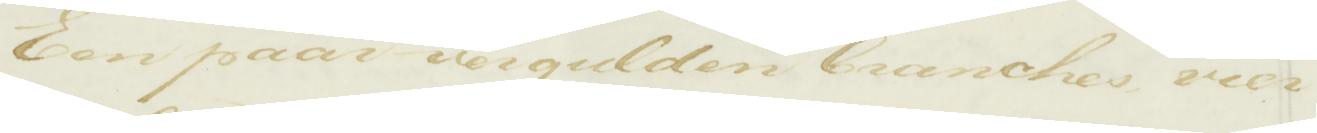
Een paar vergulden branches vier
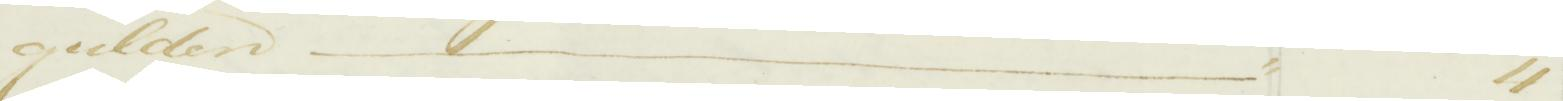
gulden ——————————— „ 4
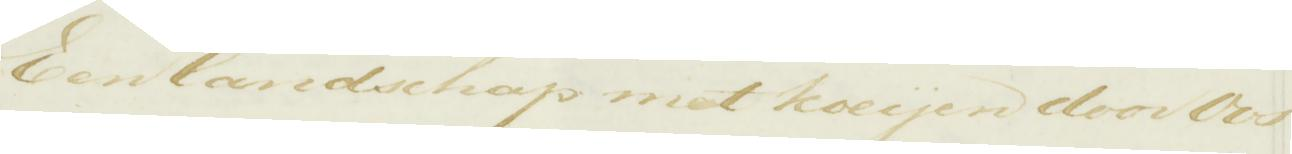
Een landschap met koeijen door Oos
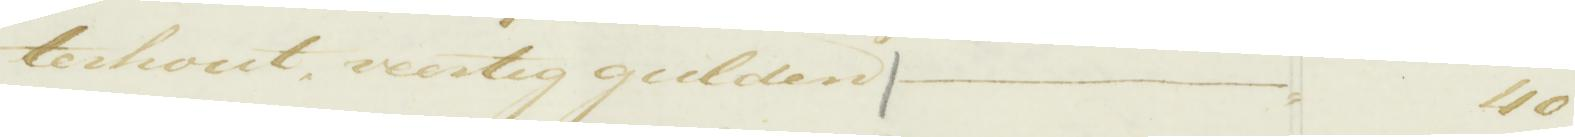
terhout, veertig gulden / ———— „ 40
